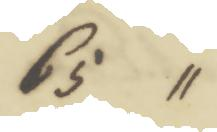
65 „
